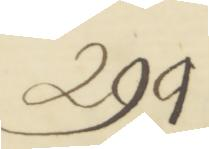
294
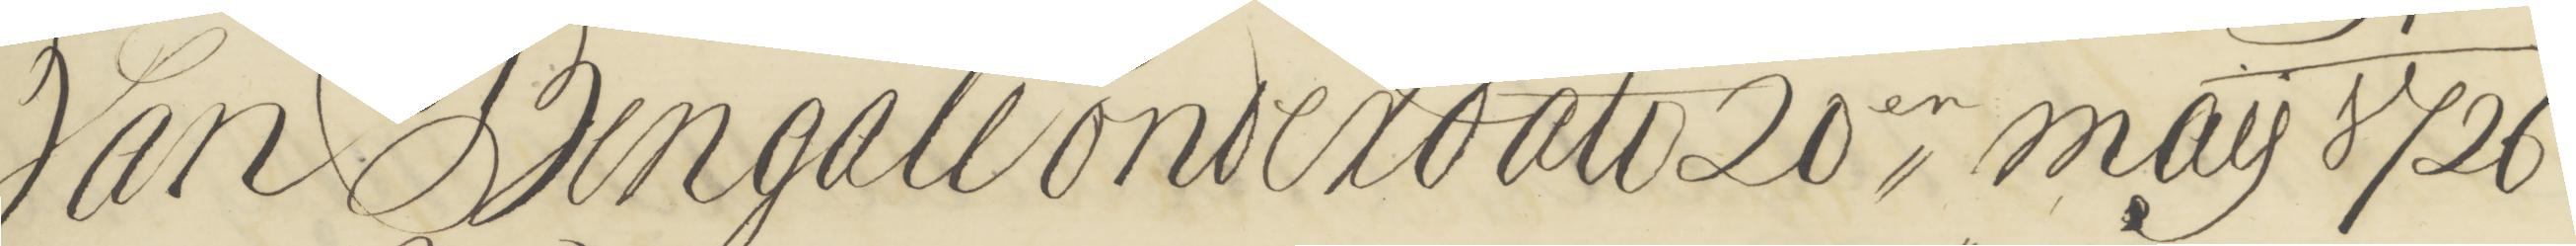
Van Bengale onderdato 20„en maij 1726.
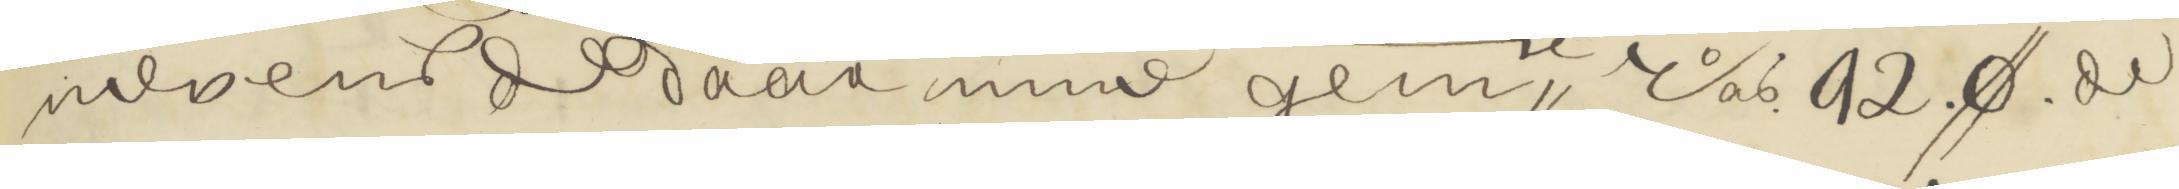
nevens de daar inne gem„n ro/as. 42.Ø. de
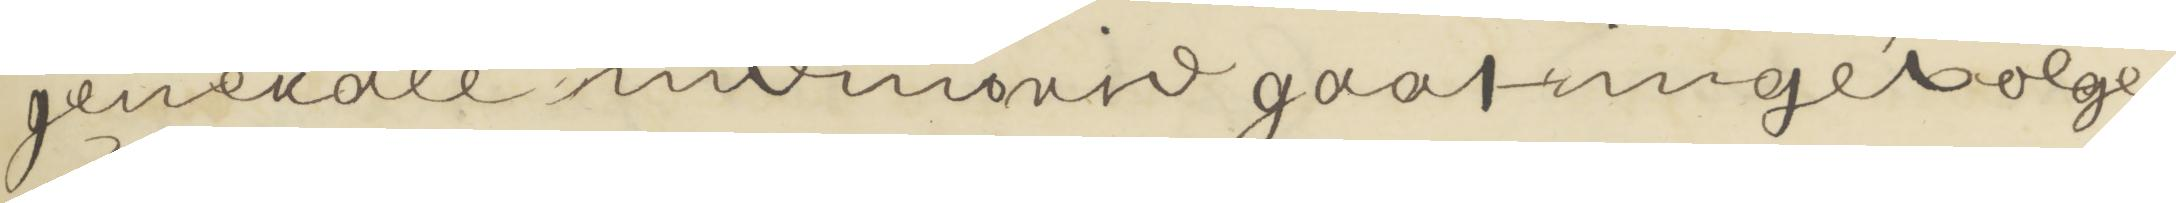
generale memorie gaat ingevolge
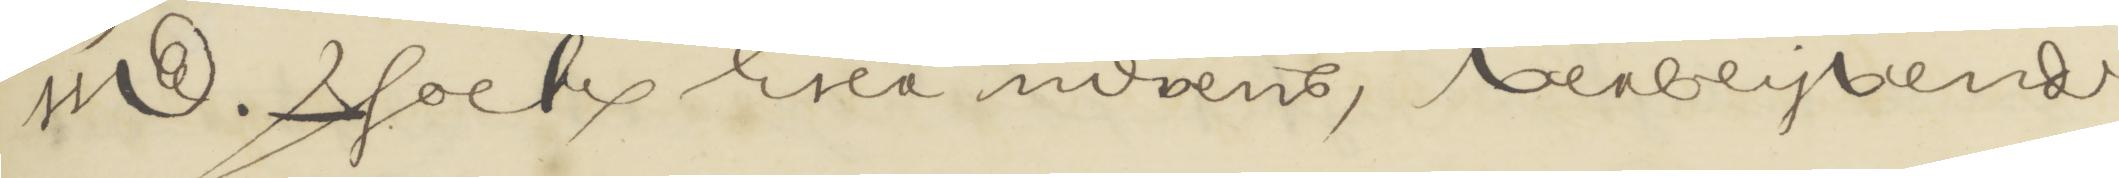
uE. versoek hier nevens, verblijvende
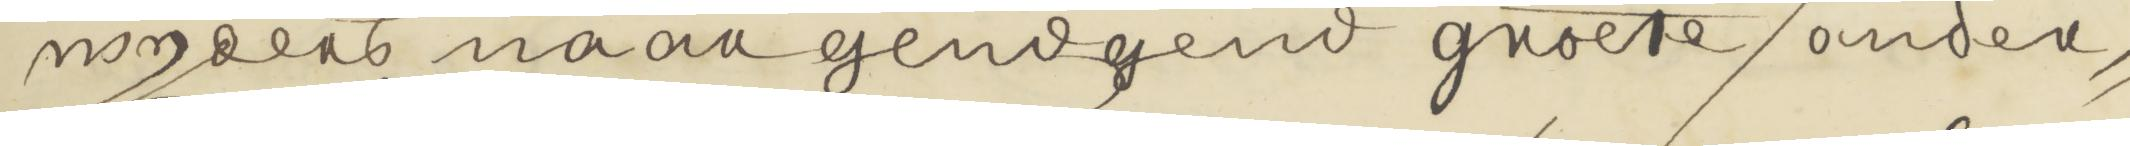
wijders naar genegene groete / onder„
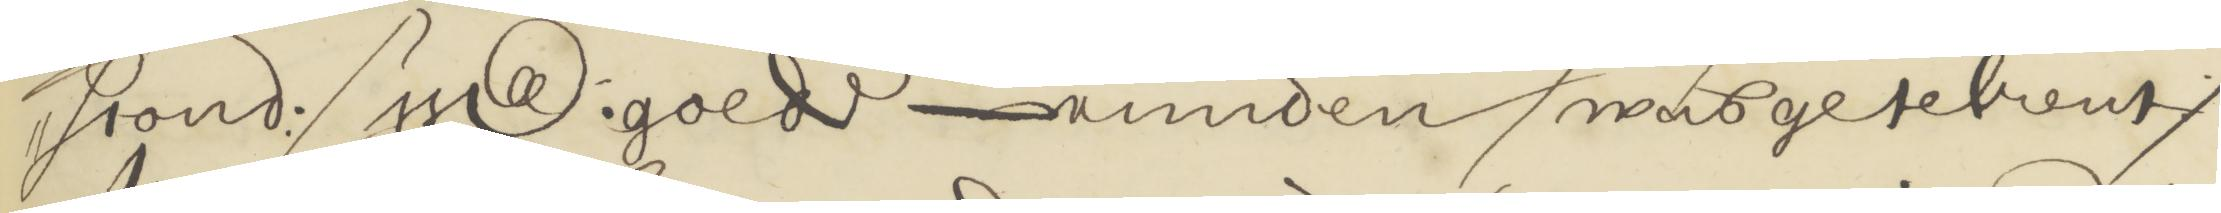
stond:/ uE: goede vrunden /was getekent:/
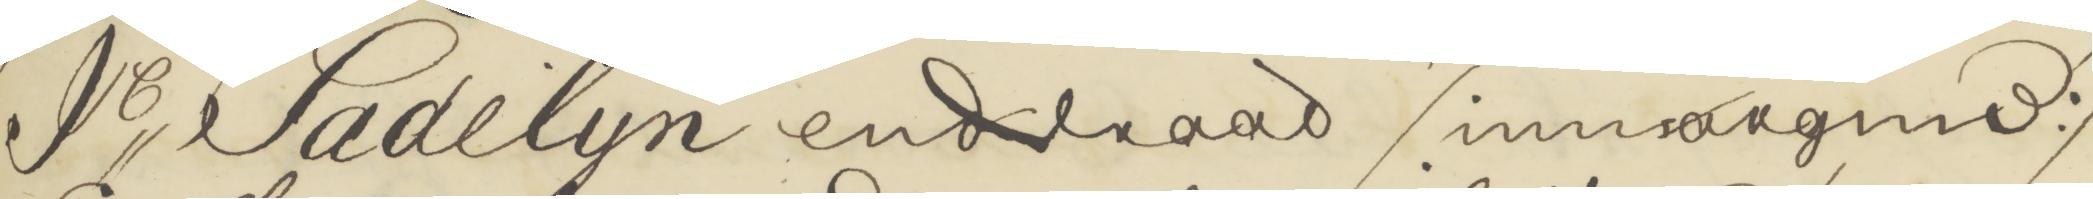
I„b Sadelijn en de raad /inmargine:/
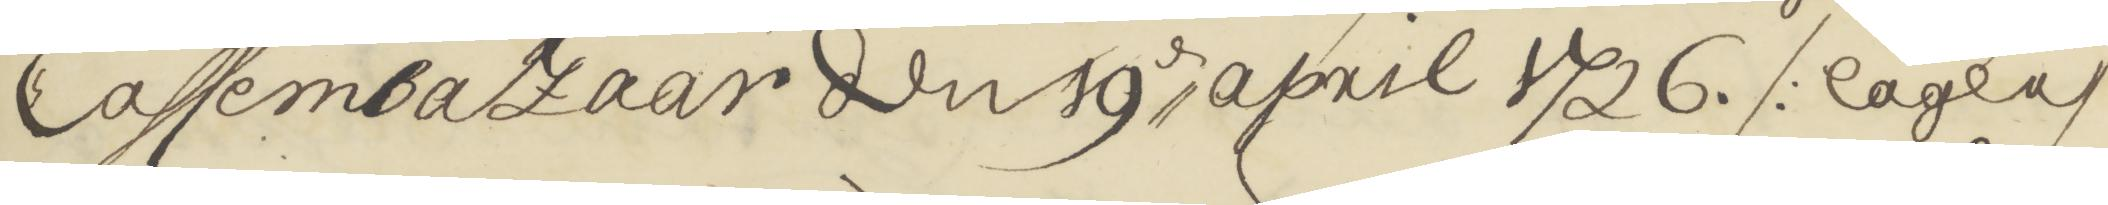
Cassembazaar den 19„en april 1726. /:lager/
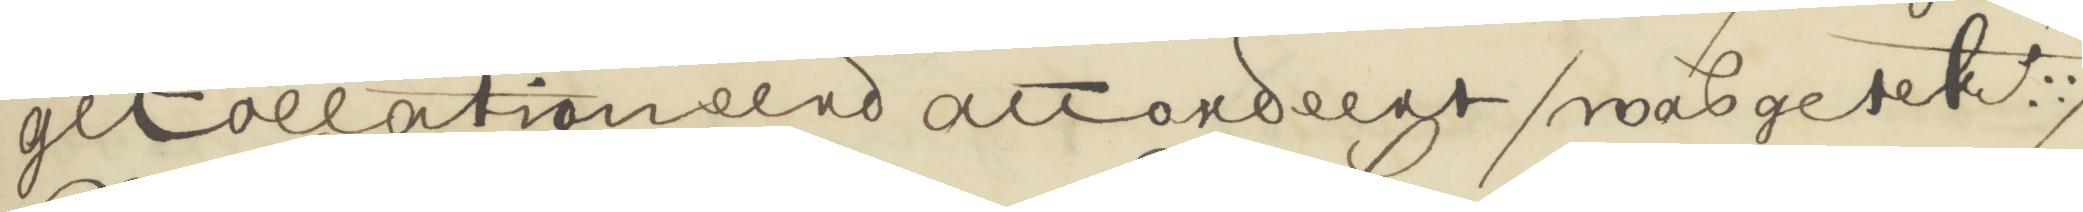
gecollationeerd accordeert /was getek:t:/
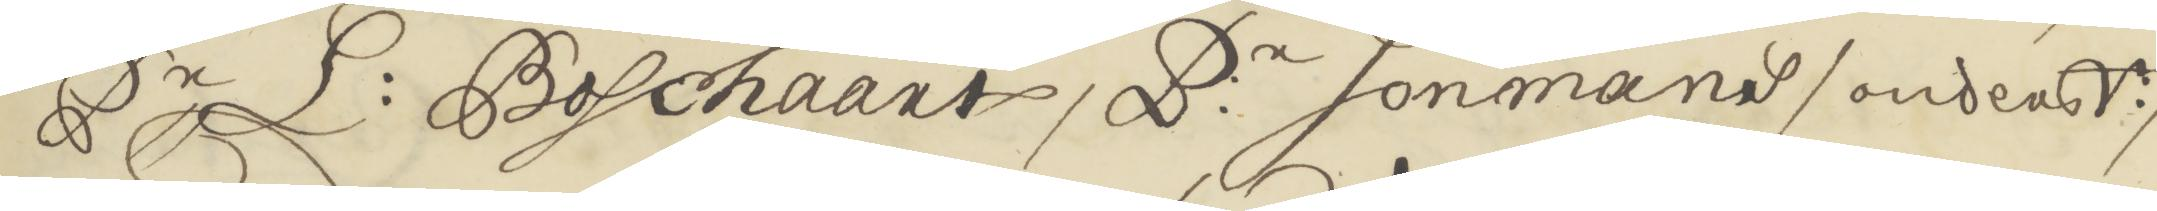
P„r L: Boschaart, P:r Sonmans / ondersz:t/
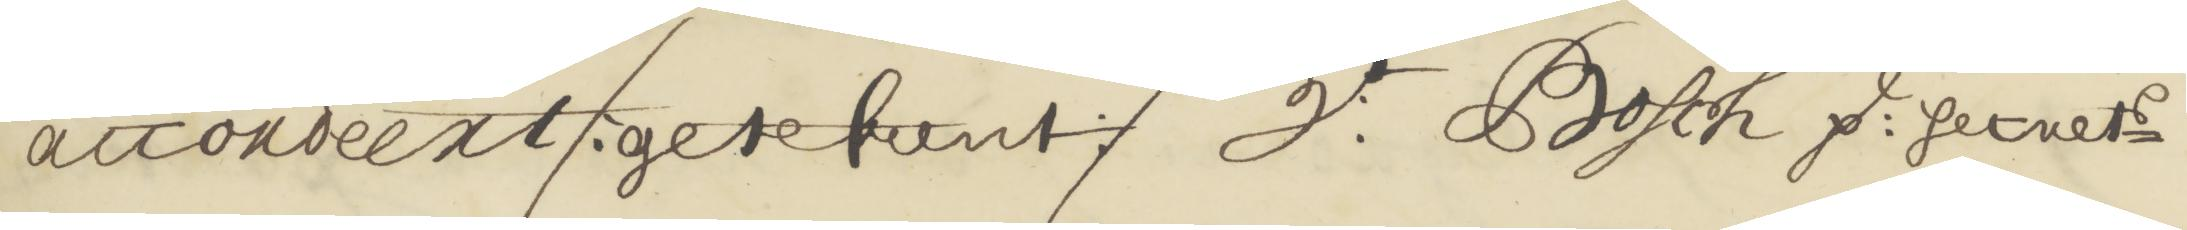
accordeert /:getekent:/ V:t Bosch p:l secret=s
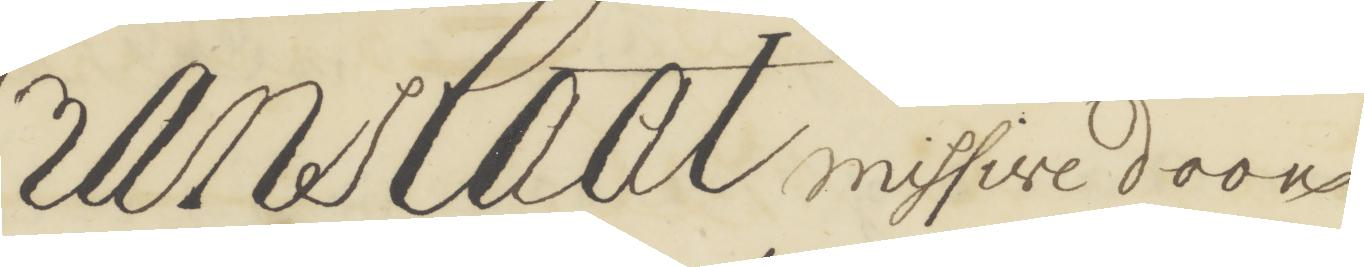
Translaat misseve door
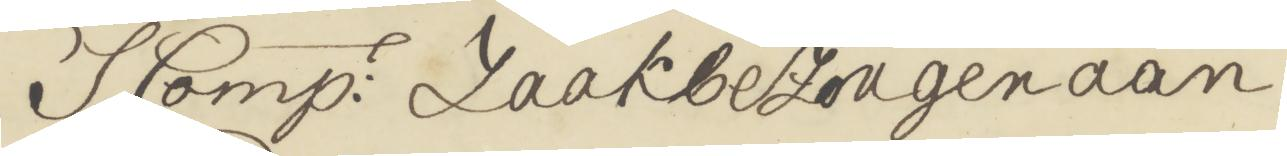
’S Comp:s zaakbezorger aan
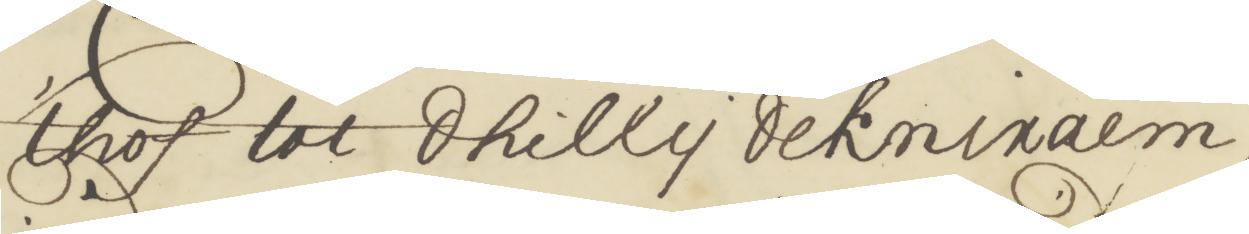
'thof tot dhillij dekniraem
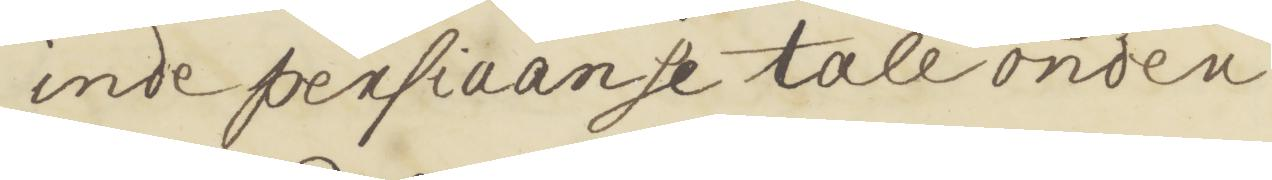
inde persiaanse tale onder
